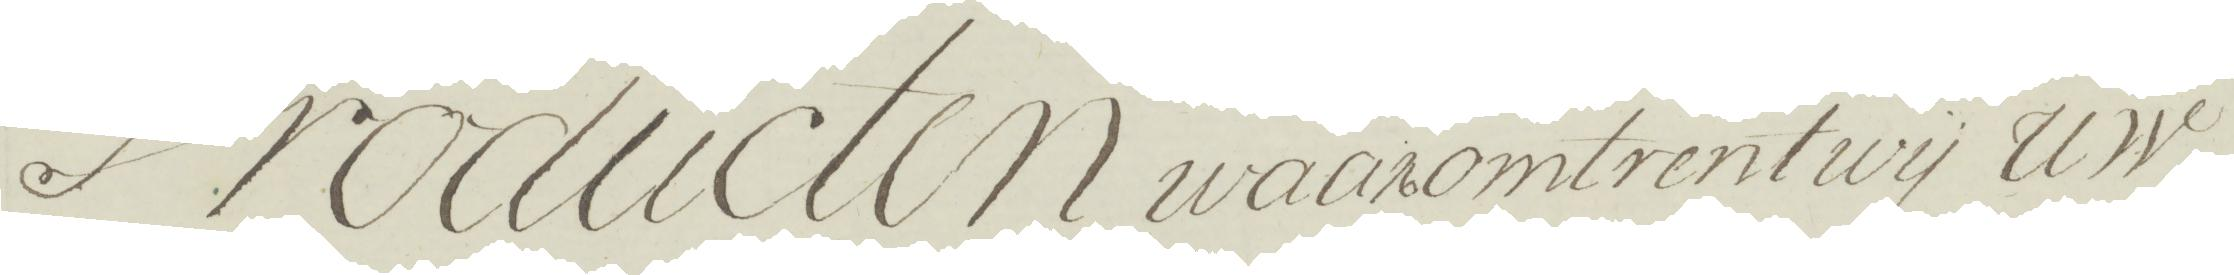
Producten waar omtrent wij Uw
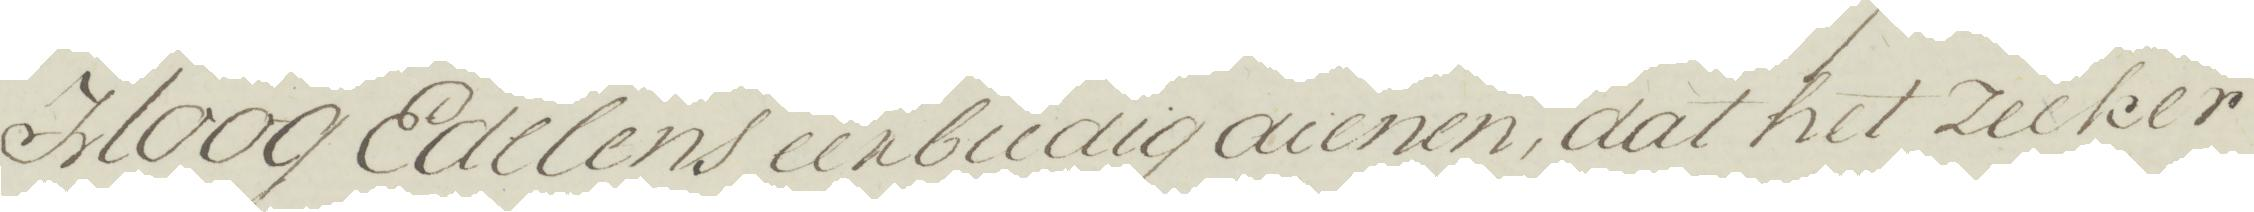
Hoog Edelens eerbiedig dienen, dat het zeeker
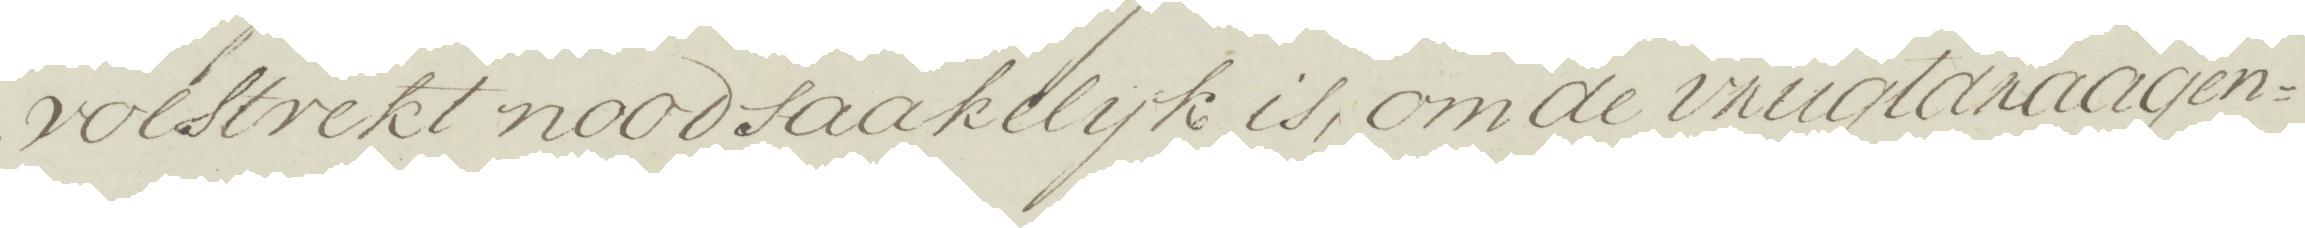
volstrekt noodsaakelyk is, om de vrugtdraagen=
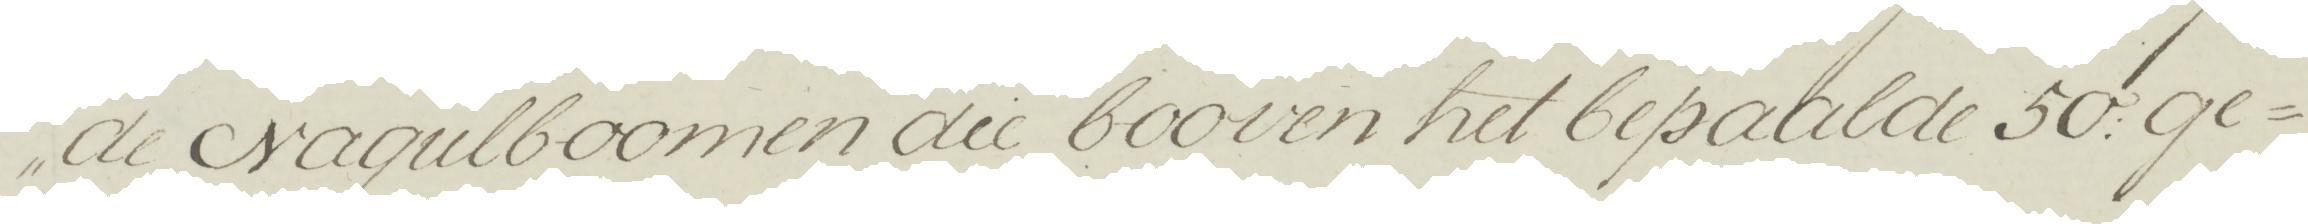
„de Nagulboomen die booven het bepaalde 50: ge=
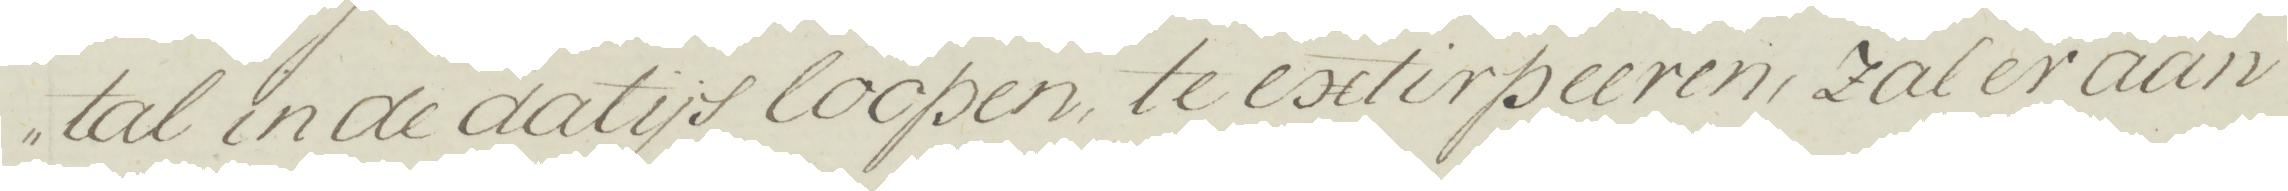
„tal in de datijs loopen, te extirpeeren, zal er aan
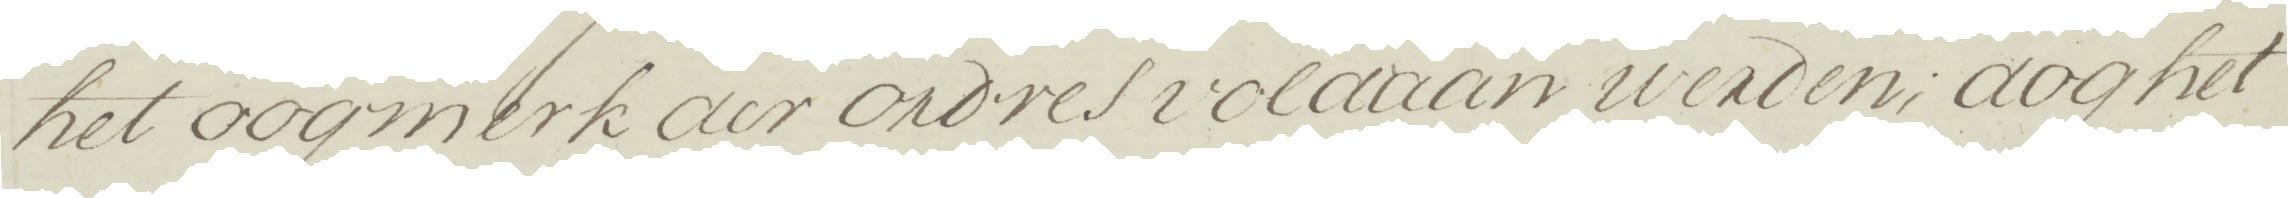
het oogmerk der ordres voldaan werden; dog het
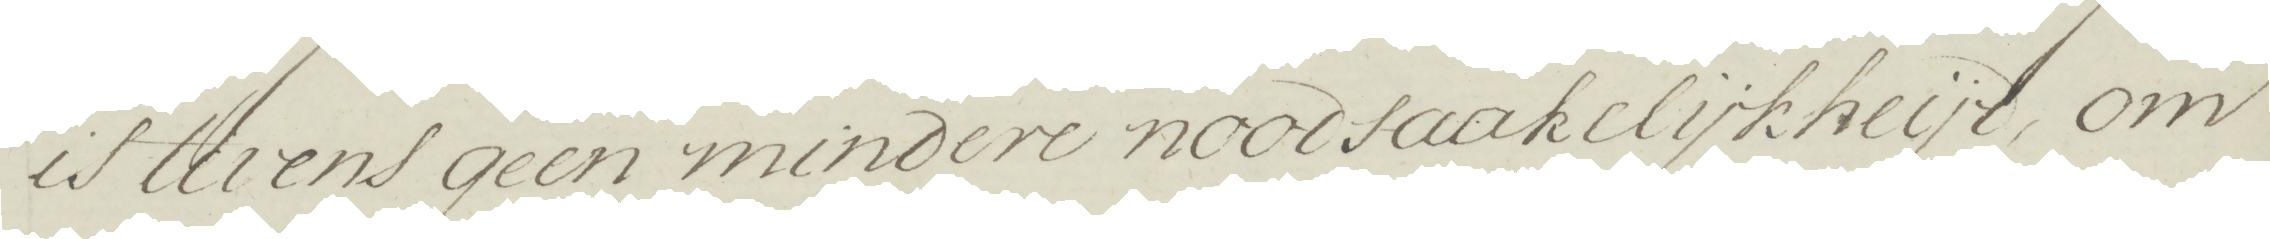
is tevens geen mindere noodsaakelijkheijd, om
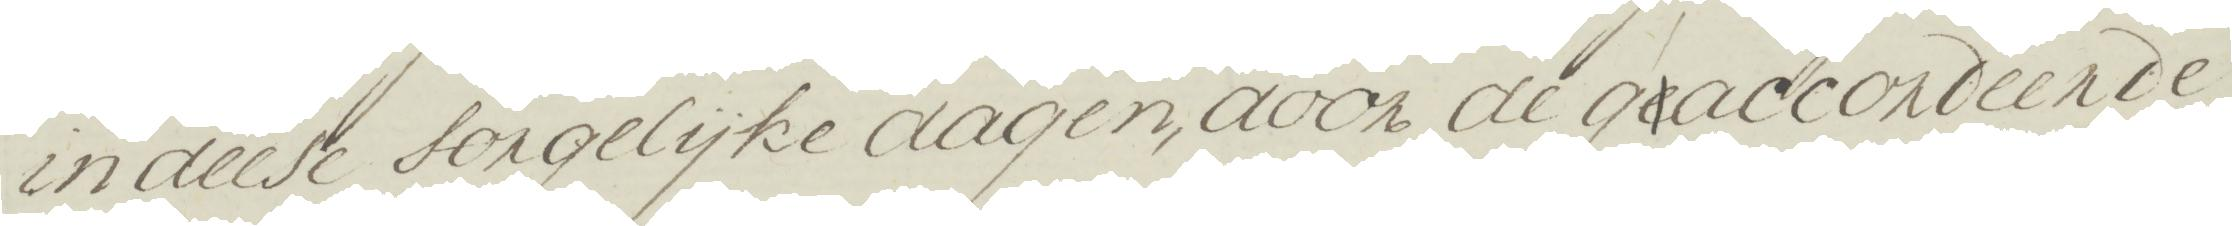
in deese sorgelijke dagen, door de g'eaccordeerde
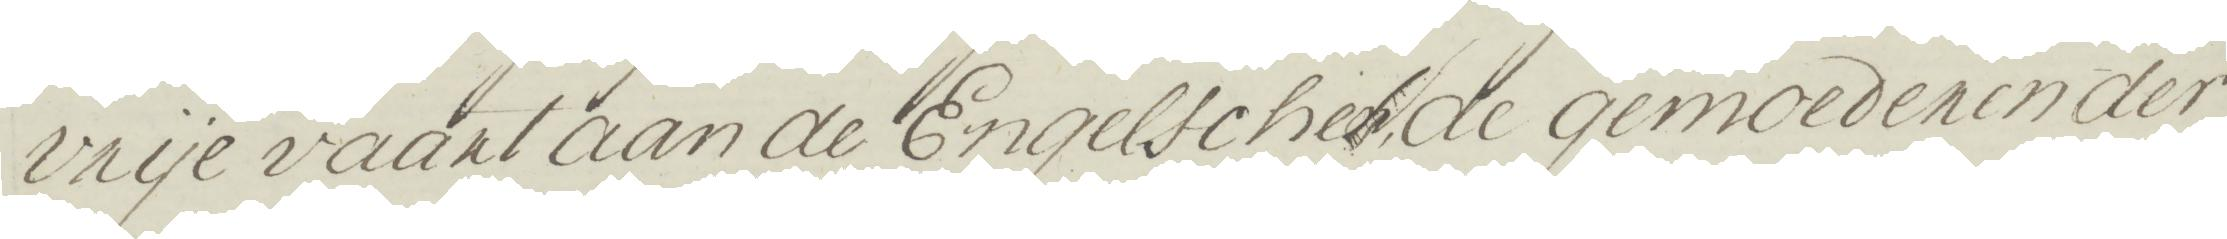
vrije vaart aan de Engelscher de gemoederen der
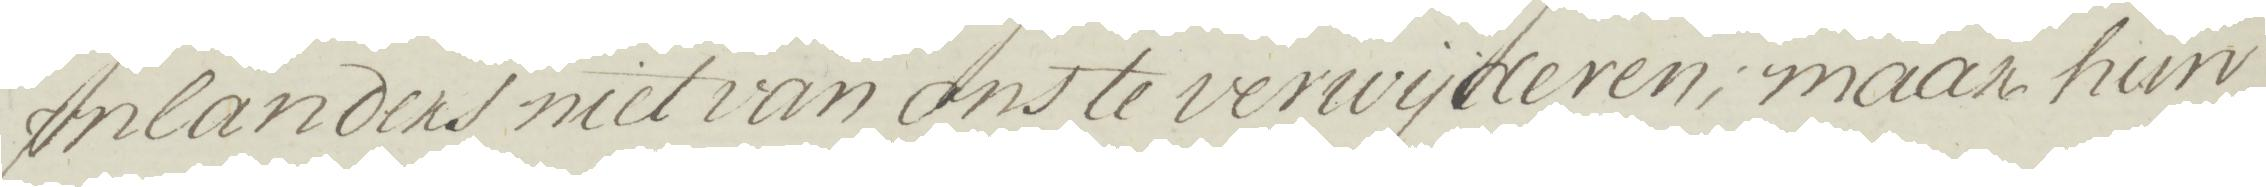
Inlanders niet van ons te verwijderen; maar hun
